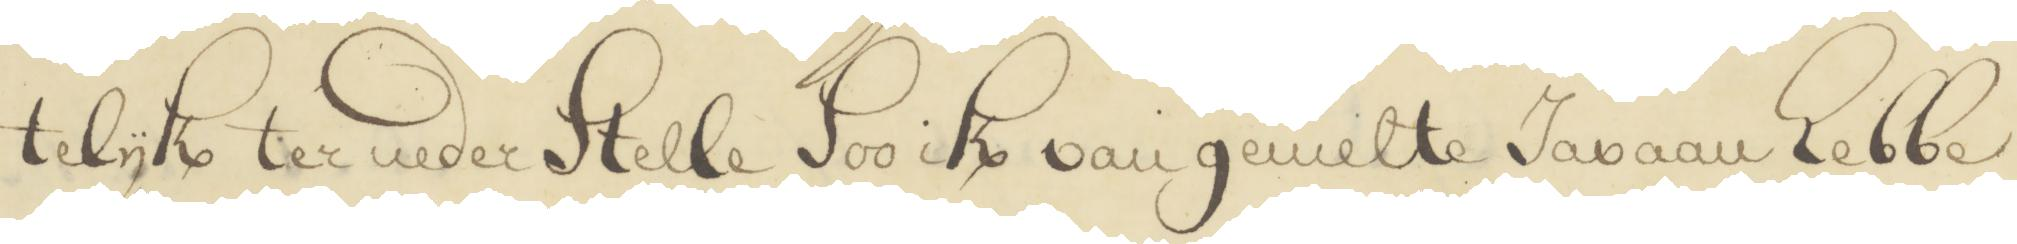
telijk ter neder stelle soo ik van gemelte Iavaan hebbe
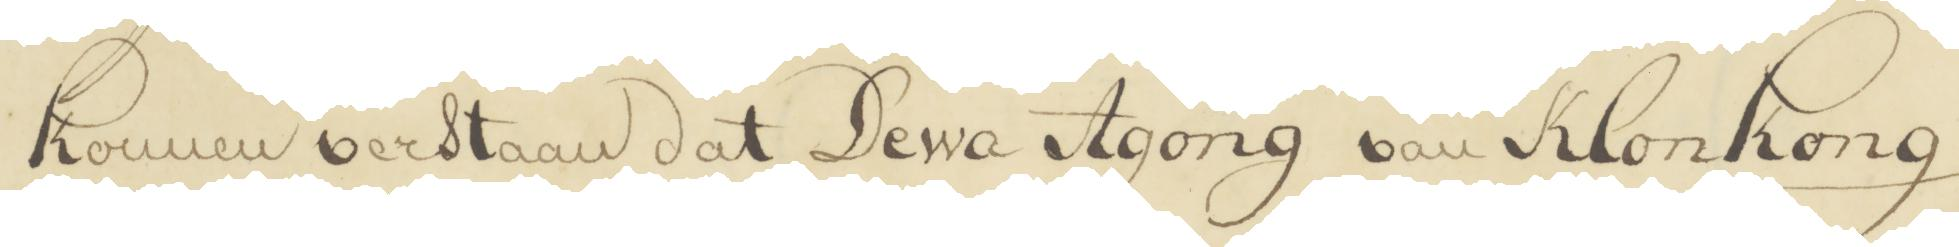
konnen verstaan dat Dewa Agong van Klonkong
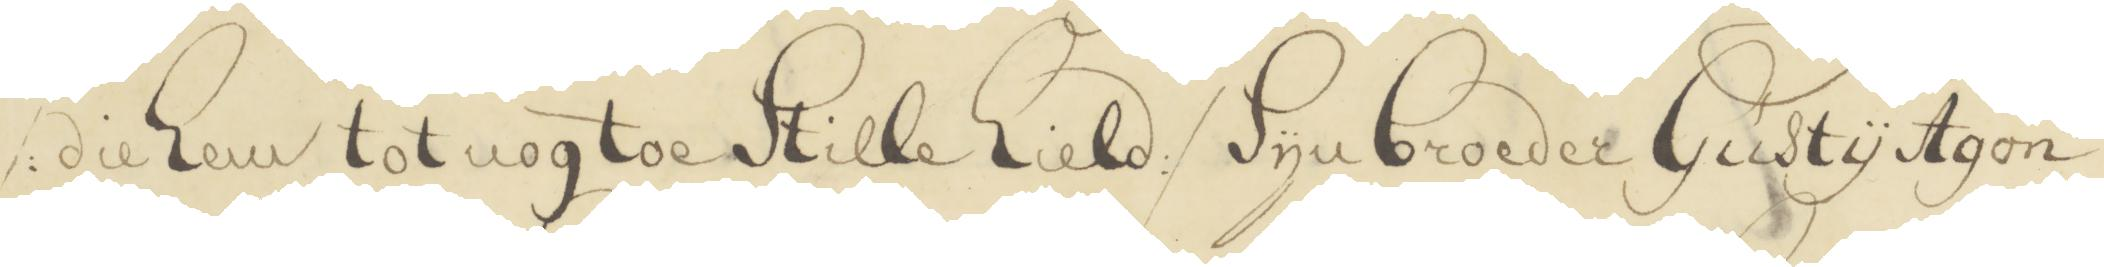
/:die hem tot nog toe stille hield:/ sijn broeder Gustij Agon
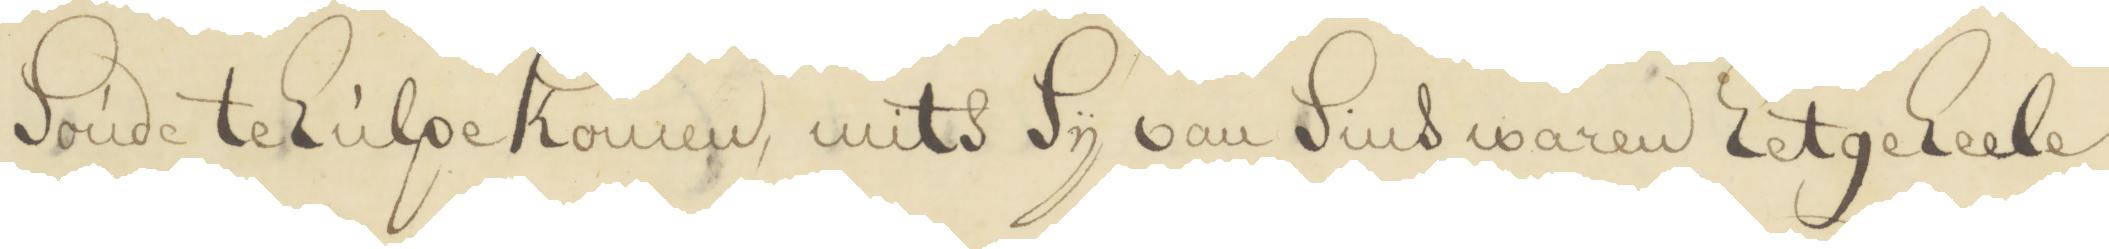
soude te hulpe komen, mits sij van sins waren het geheele
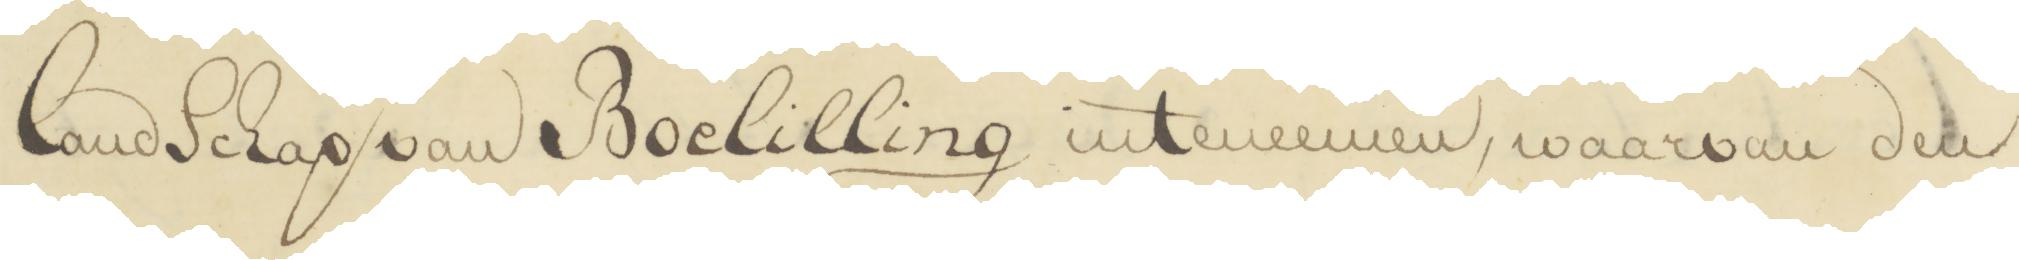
landschap van Boelilling inteneemen, waarvan den
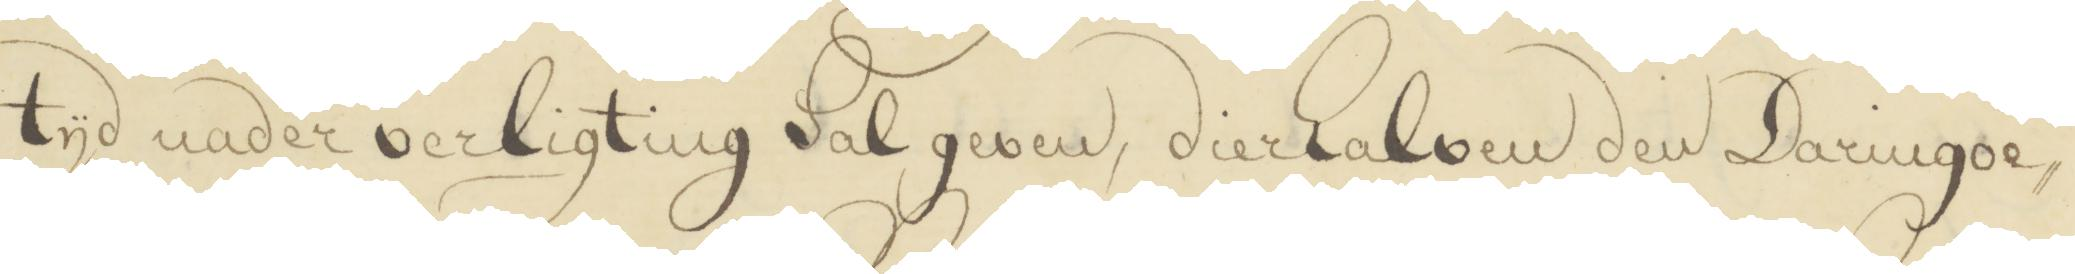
tijd nader verligting sal geven, dier halven den Daringoe„
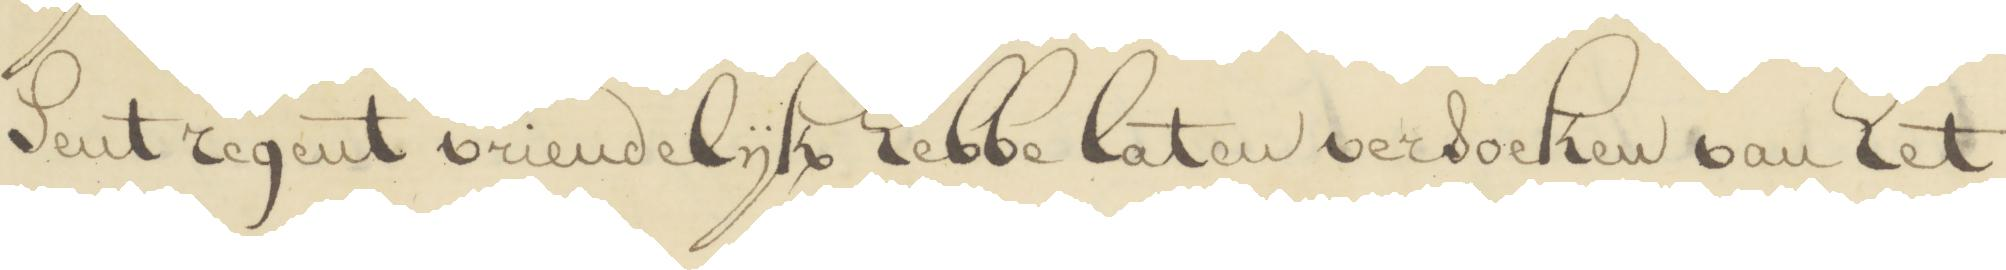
sent regent vriendelijk hebbe laten versoeken van het
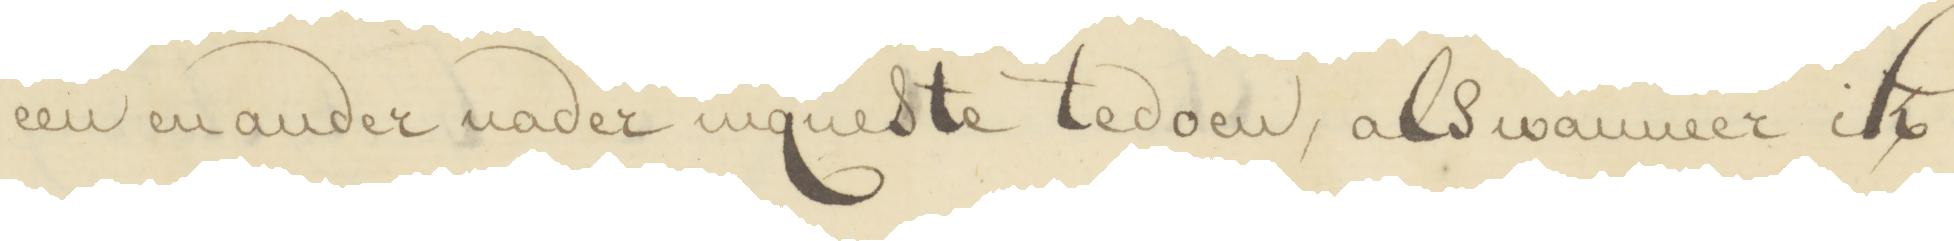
een en ander nader inqueste tedoen, als wanneer ik
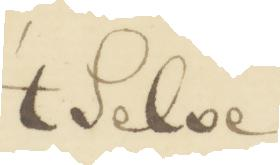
't selve
